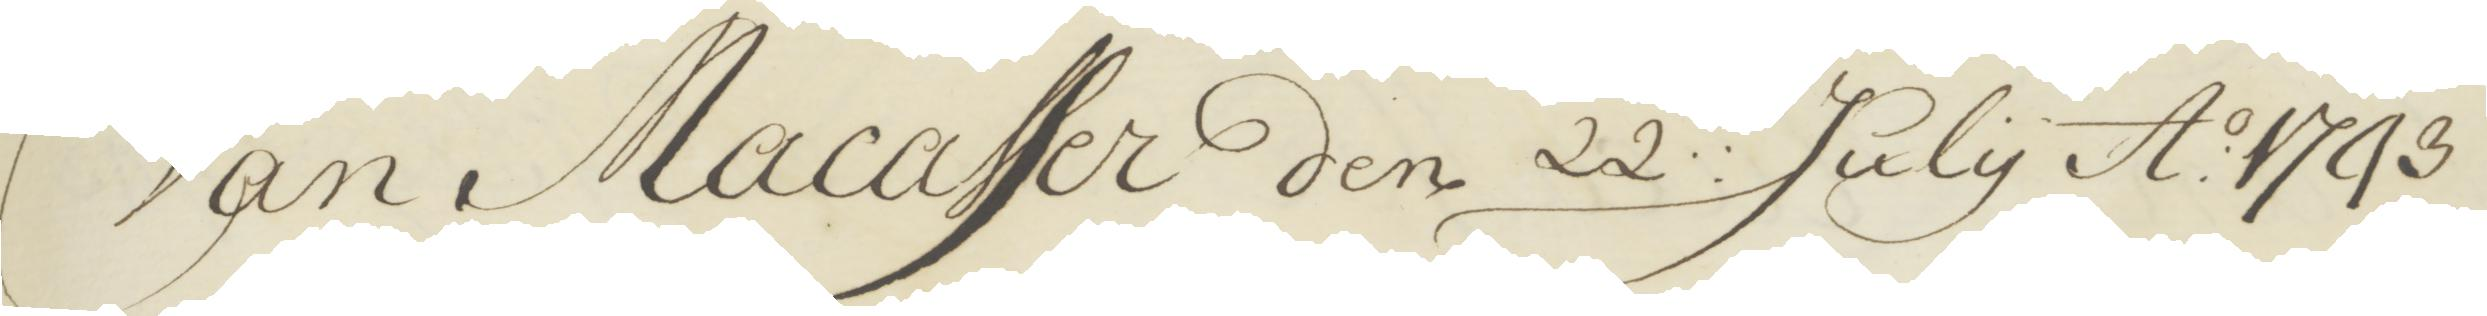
Van Macasser den 22.:e: Julij A:o 1743
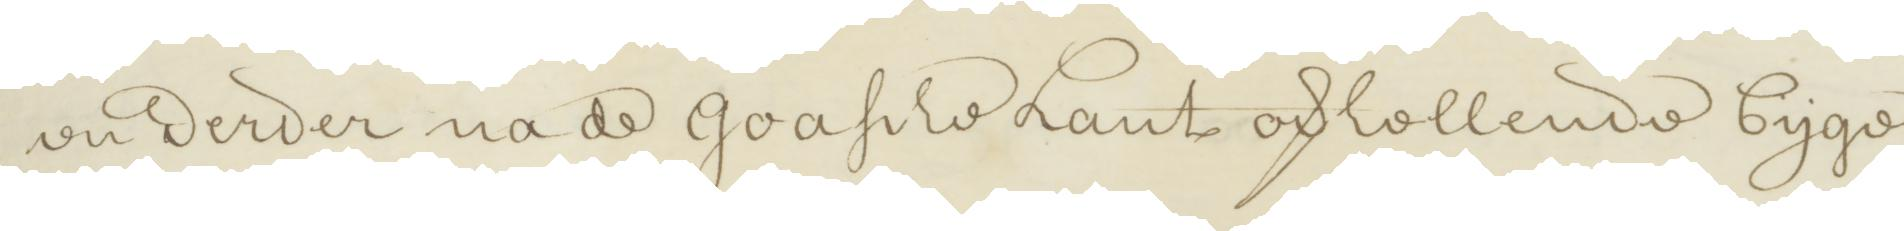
en Eerder na de goasche kant overhellende bijge
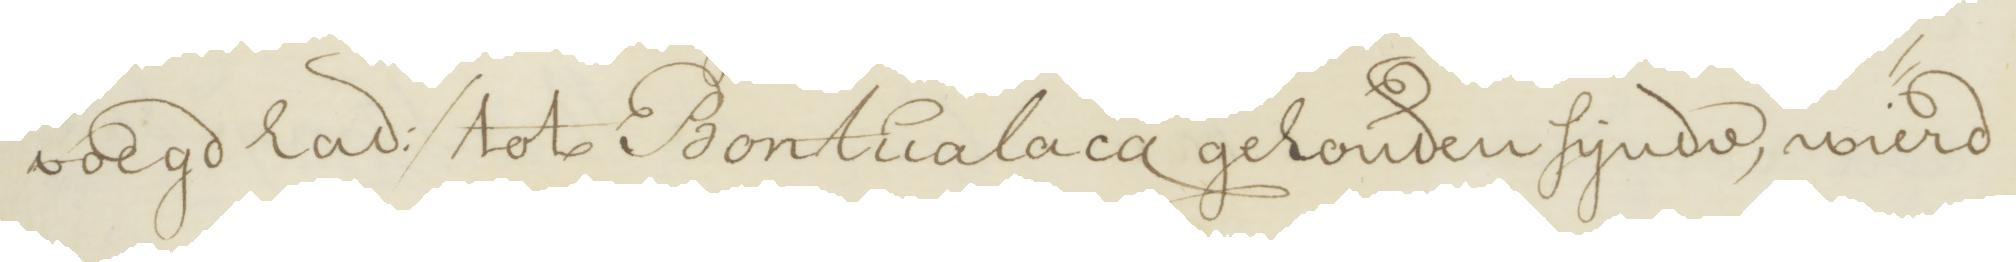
voegd had:/ tot Bontualacq gehouden sijnde, wierd
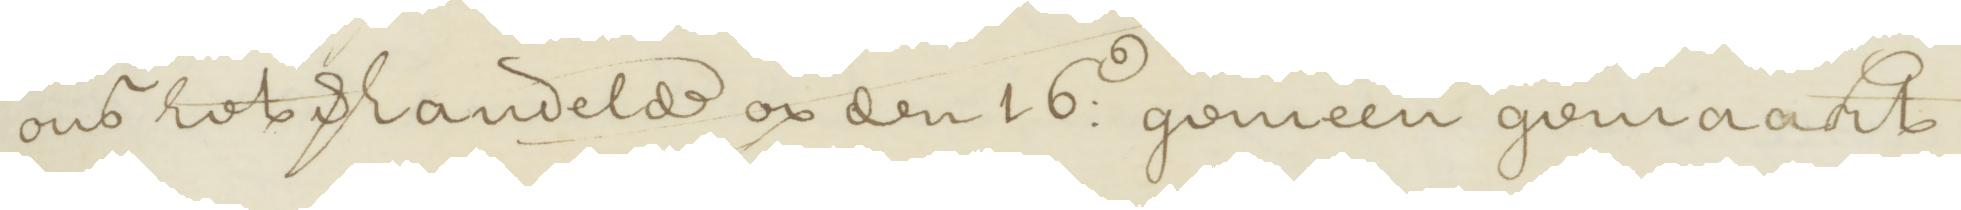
ons het verhandelde op den 16:e gemeen gemaakt
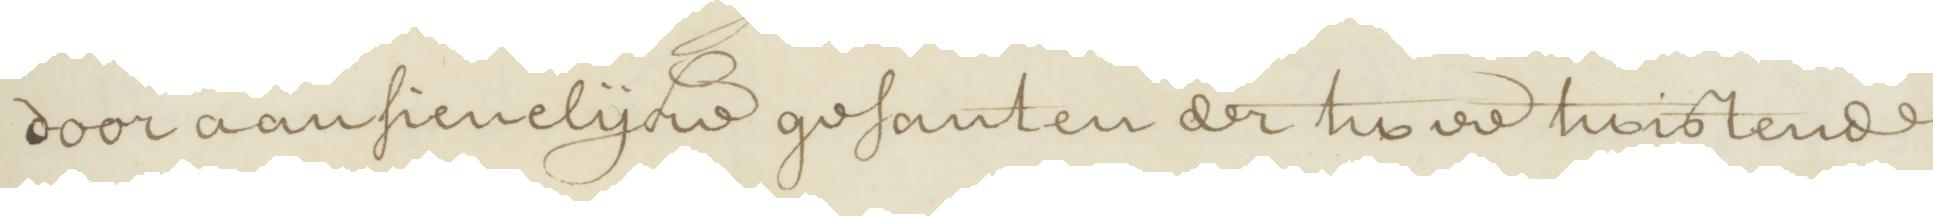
door aansienelijke gesanten der twee twistende
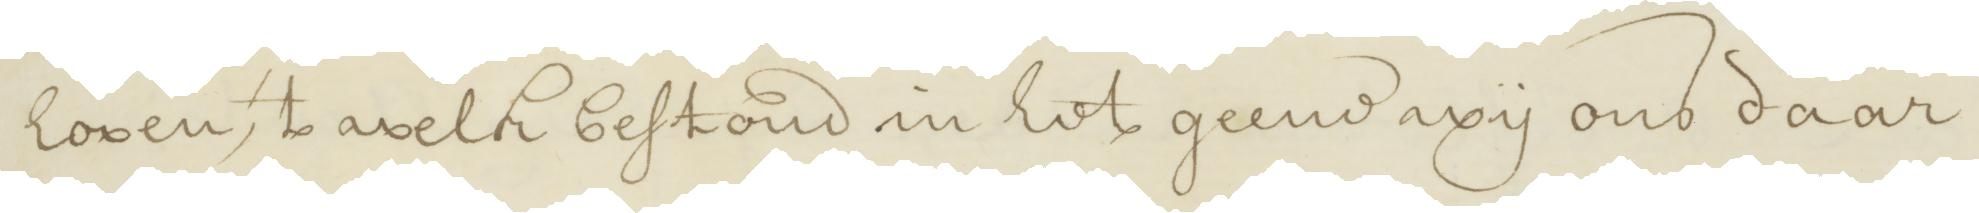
hoven, ’t welk bestond in het geene wij ons daar
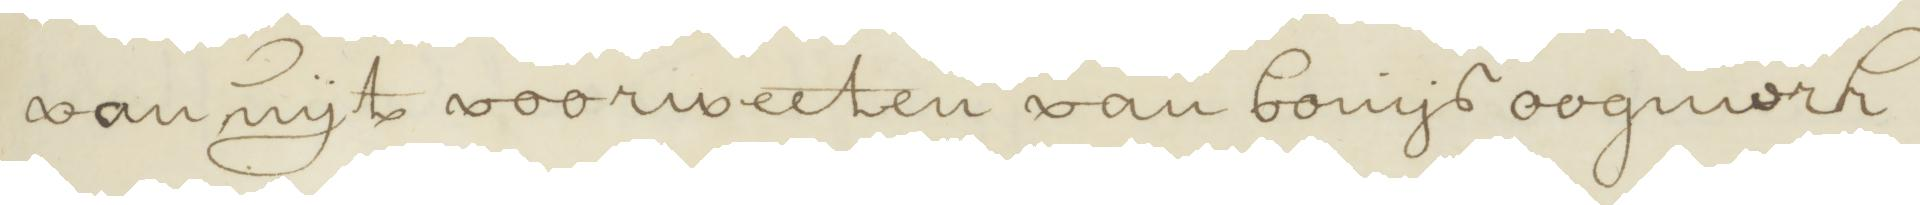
van uijt voorweeten van bonijs oogmerk
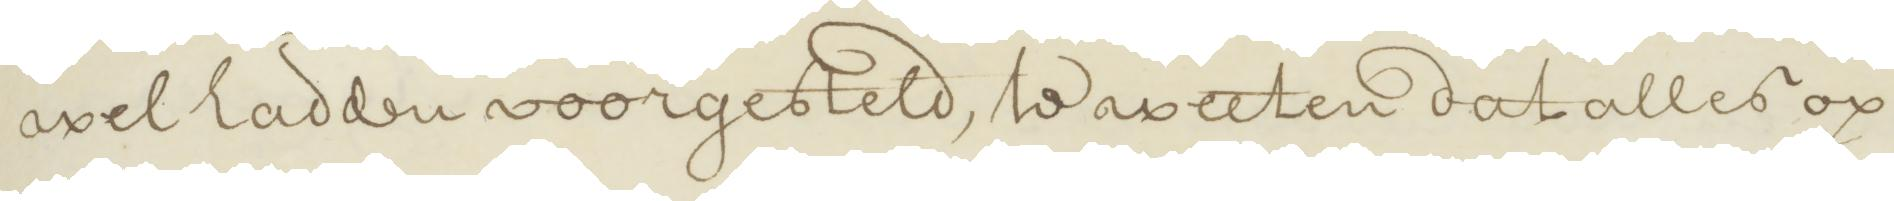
wel hadden voorgesteld, te weeten dat alles op
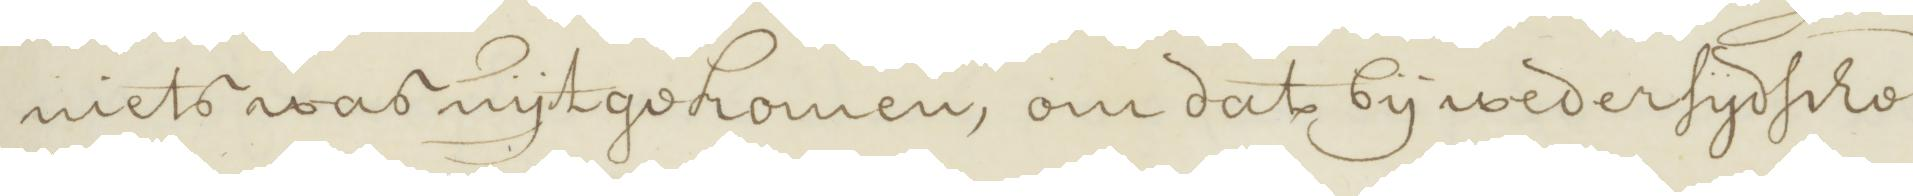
niets was uijtgekomen, om dat bij wedersijdsche
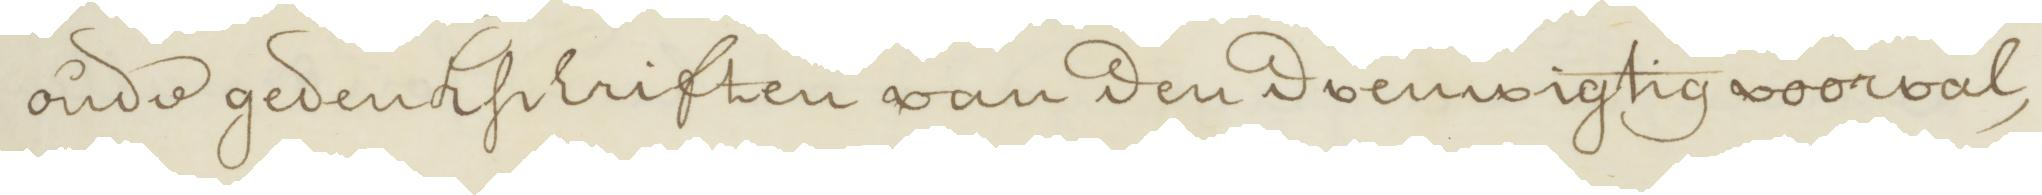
oude gedenkschriften van Een Evenwigtig voorval,
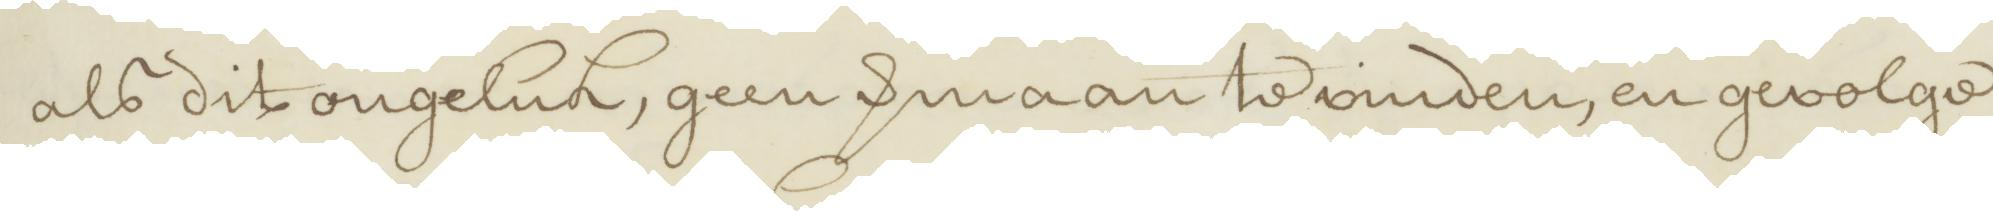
als dit ongeluk, geen vermaan te vinden, en gevolge
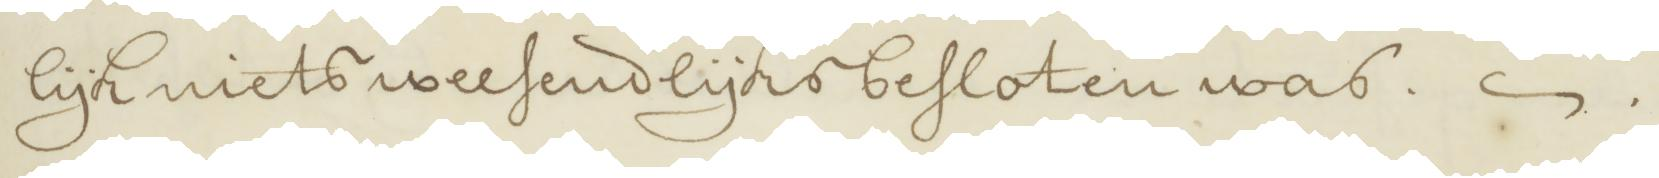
lijk niets weesendlijks besloten was.—.
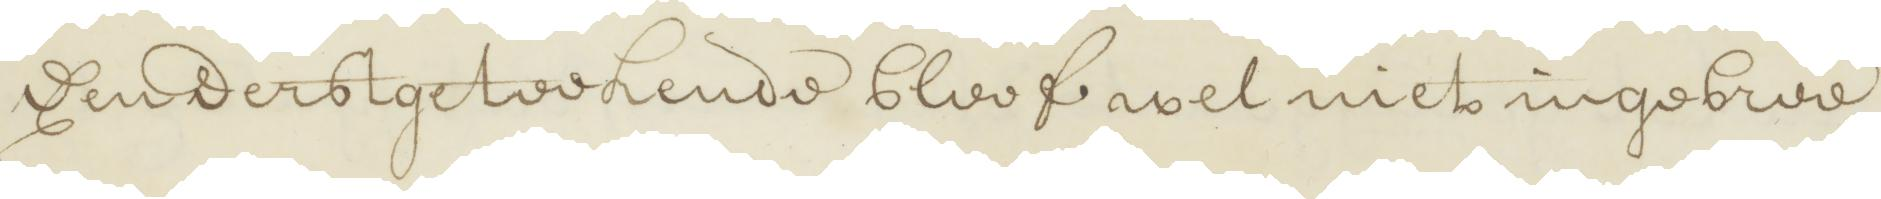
Den Eerstgeteekende bleef wel niet ingebree
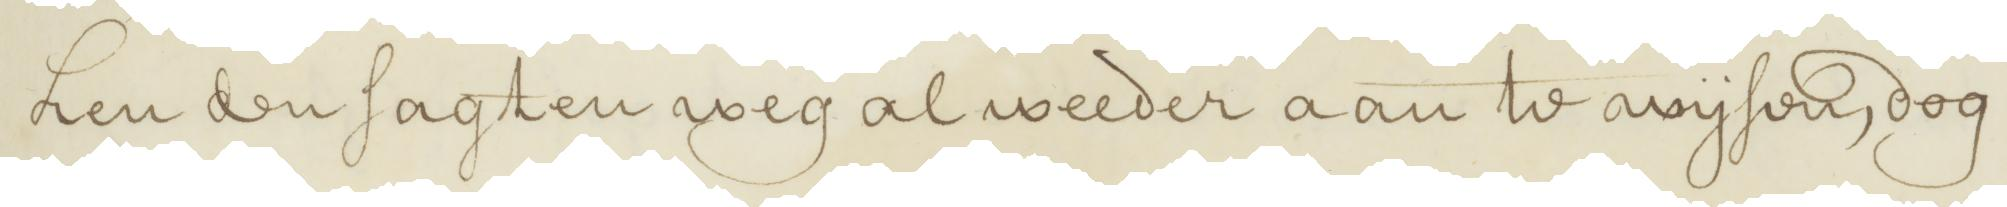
ken den sagten weg al weeder aan te wijsen, dog
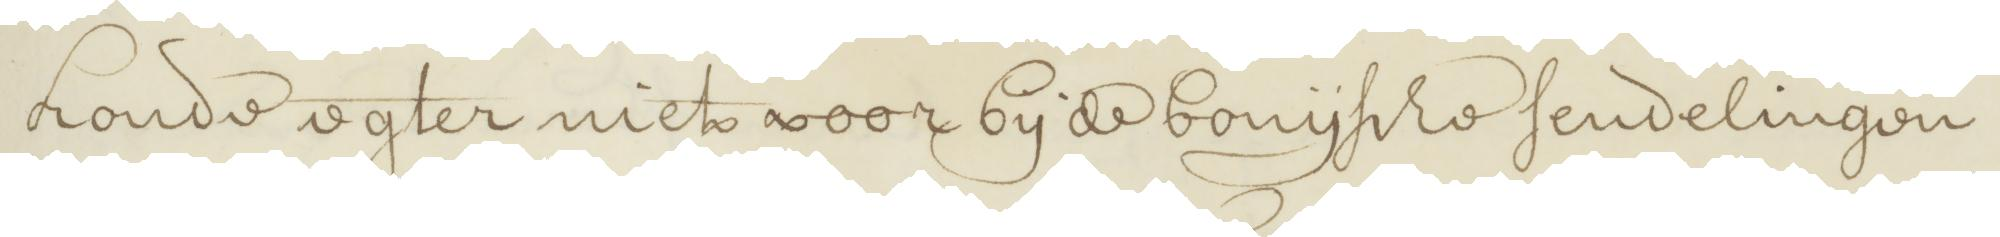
konde egter niet voor bij de bonijsche sendelingen
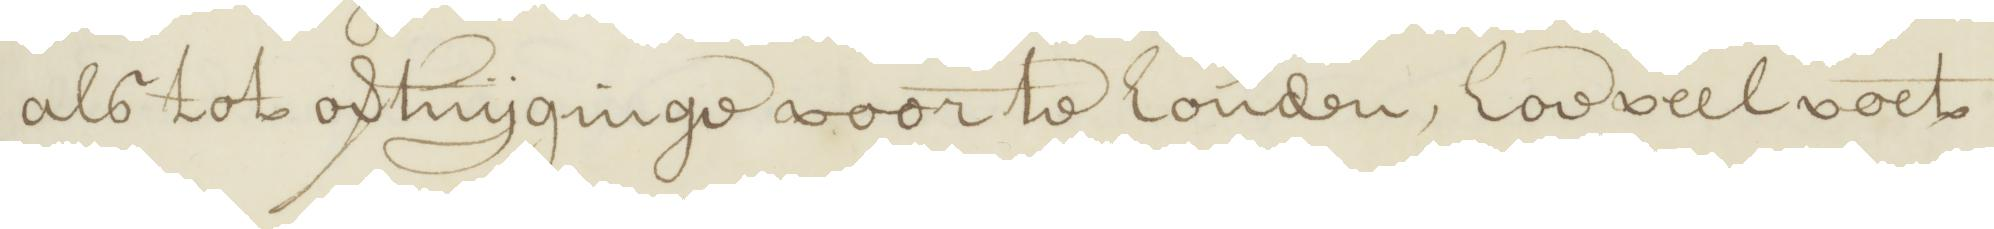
als tot overtuijginge voor te houden, hoeveel voet
